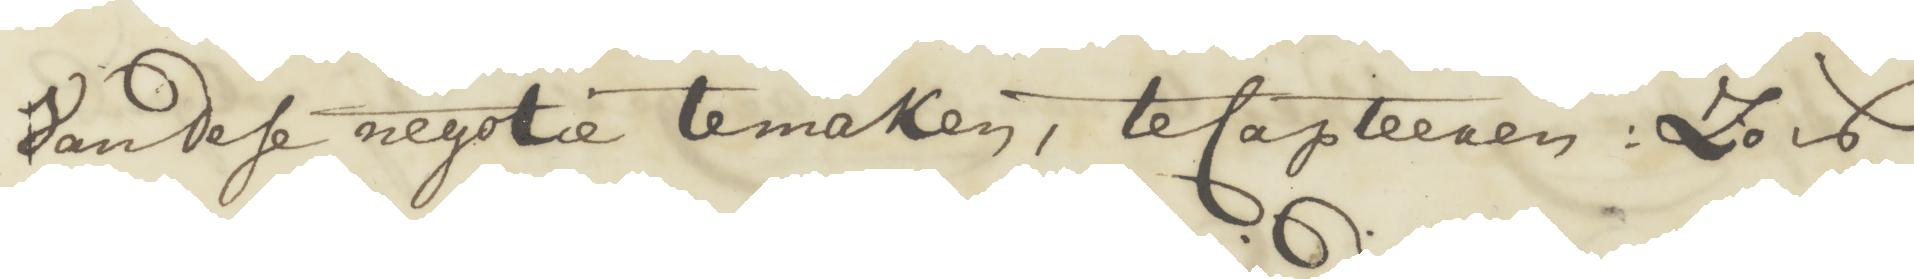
van dese negotie temaken, te Capteeren: zo is
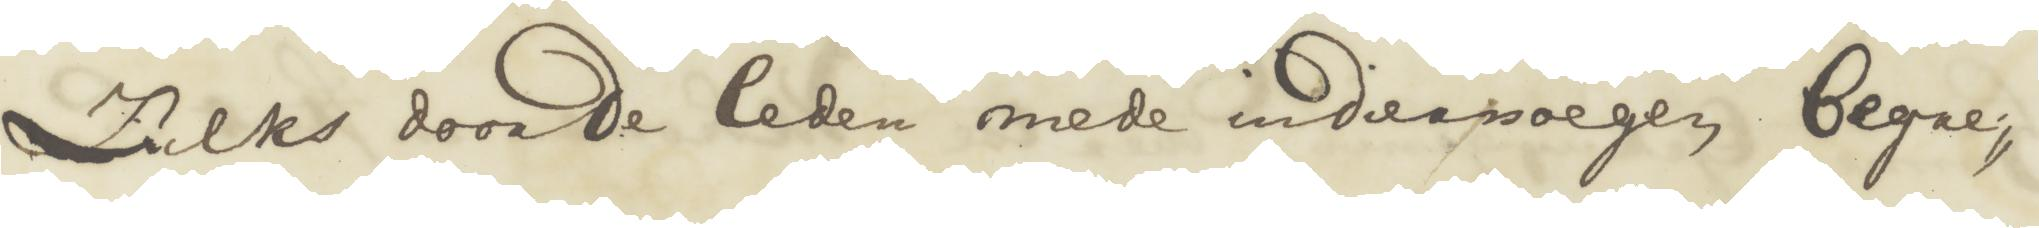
zulks door de leden mede indervoegen begre„
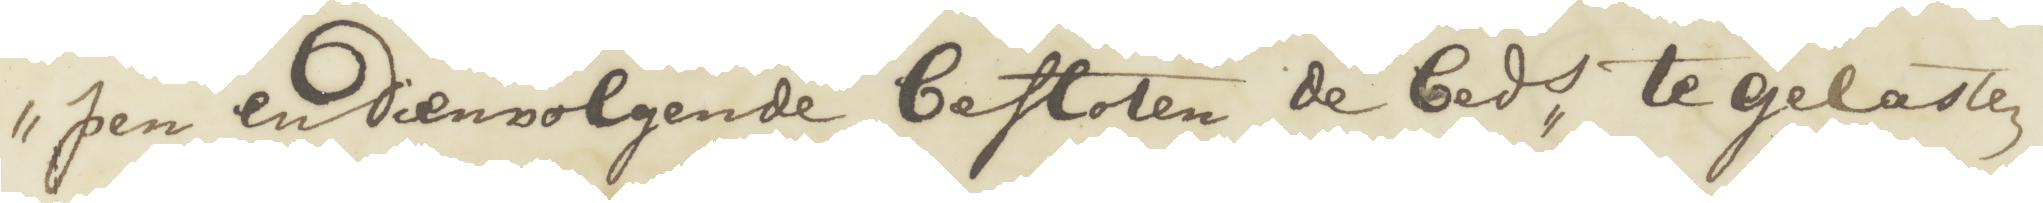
„pen en dienvolgende besloten de bed„s te gelasten
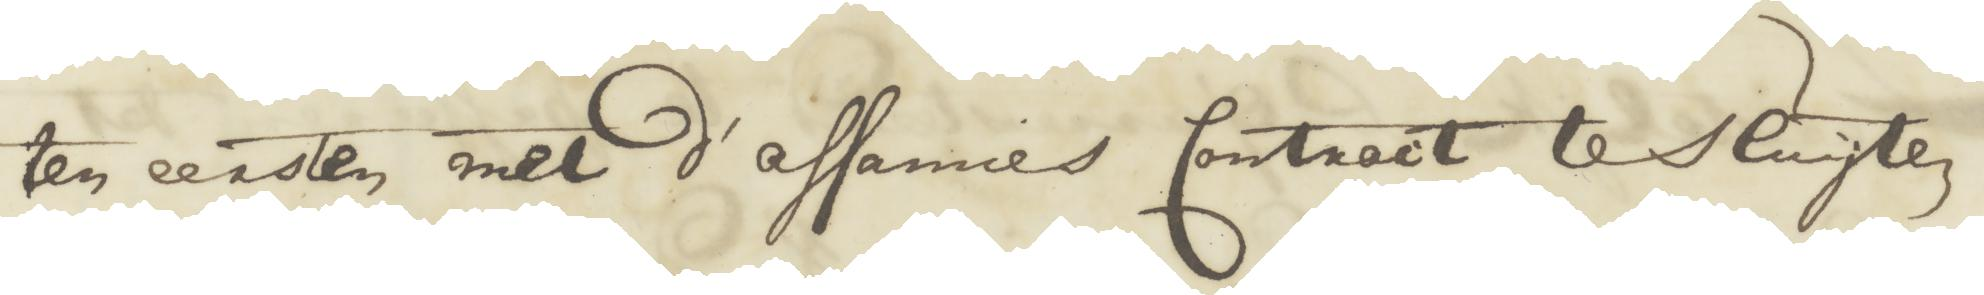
ten eersten met d’ assamies Contract te sluijten
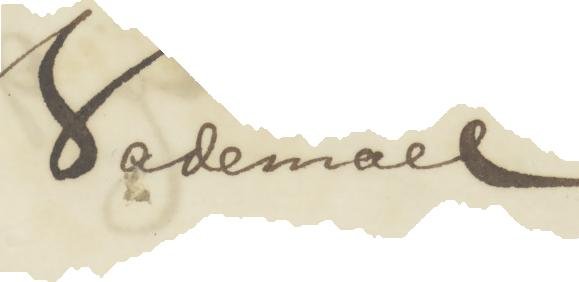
Nademael
